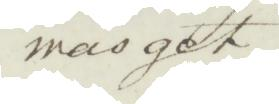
was get.
